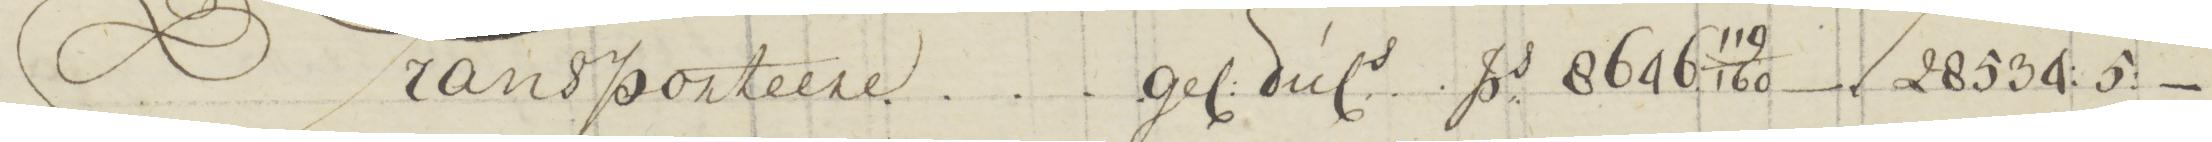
Transporteere . . . - .gec: duc.s . . p„s 8646: 119/160— ƒ 28534:5:—
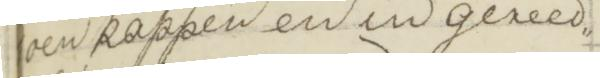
oen kappen en in gereed„
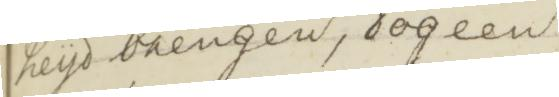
heijd brengen, dog een
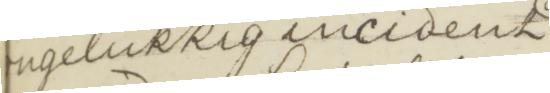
ngelukkig incident
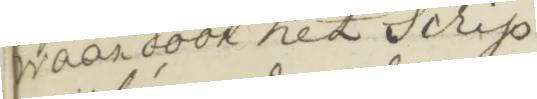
waar door het schip
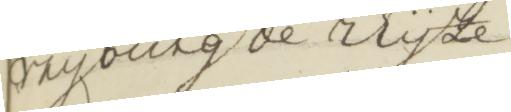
vrijburg de rhijze
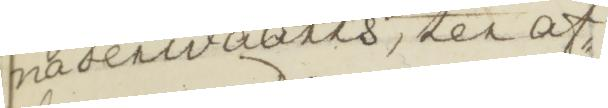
naderwaarts, ter af„
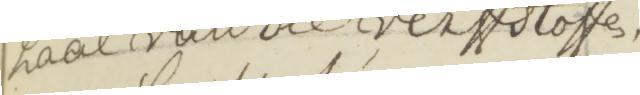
haal van die verffstoffen,
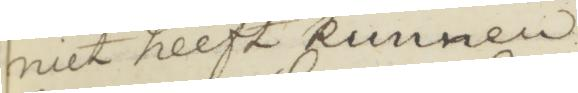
niet heeft kunnen
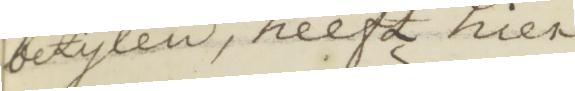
bezijlen, heeft hier
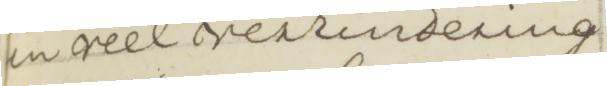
in veel verhindering
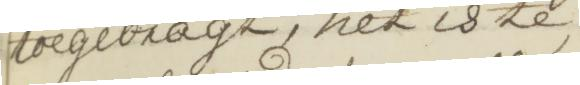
toegebragt, het is te
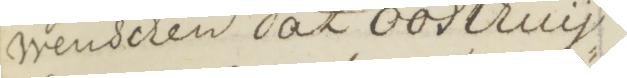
wenschen dat oosthuij„
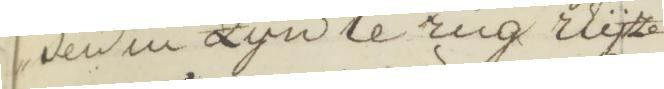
„sen in zijn te rug rhijze
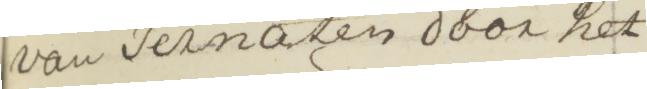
van Ternaten door het
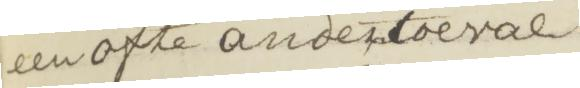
een ofte andertoeval
